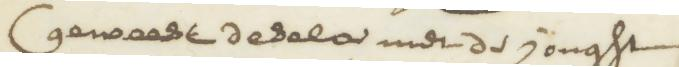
geweest deselve met de jongst
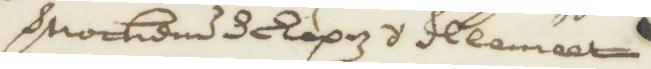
vertrockene schepen d’ ellemeet
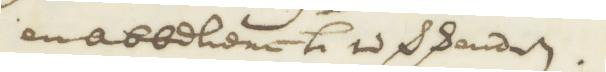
en abbekerck te versonden.
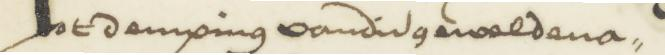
tot demping van de geweldena„
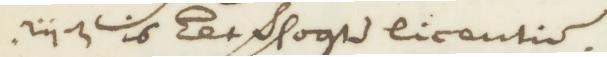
.rijen is het versogte licentie.
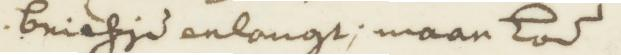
.briefje erlangt; maar hoe
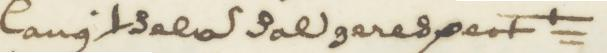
lang 't selve sal gerespect=t
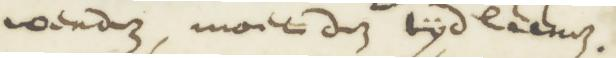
werden, moet den tijd leeren.
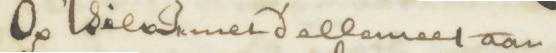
Op 't silver met d'ellemeet aan
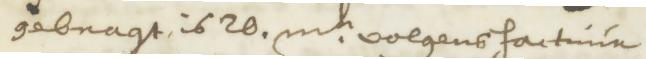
gebragt is 20. m.k volgens factuur
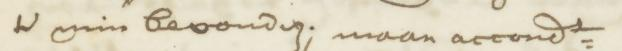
te min bevonden; maar accord=t
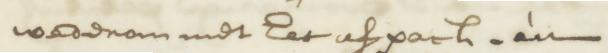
wederom met het afpack _ en
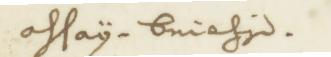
essaij_briefje.
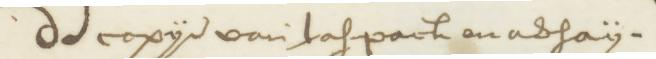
de copije van 'tafpack en essaij-
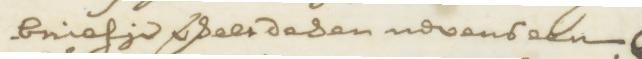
briefje verselt desen nevens een
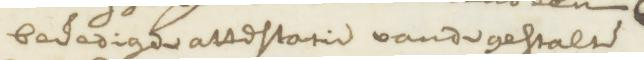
beeedigde attestatie van de gestalte
